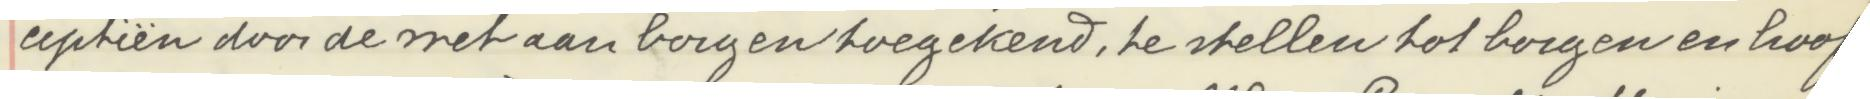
ceptien door de wet aan borgen toegekend, te stellen tot borgen en hoof
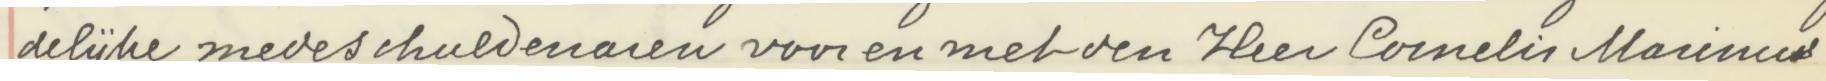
delijke medeschuldenaren voor en met den Heer Cornelis Marinus
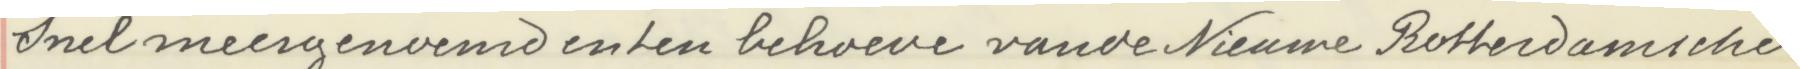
Snel meergenoemd en ten behoeve van de Nieuwe Rotterdamsche
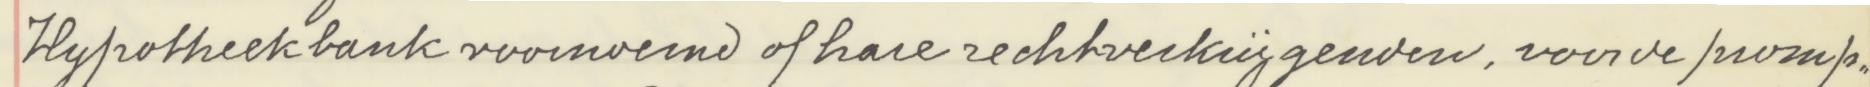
Hypotheek bank voornoemd of hare rechtverkrijgenden, voor de promp„
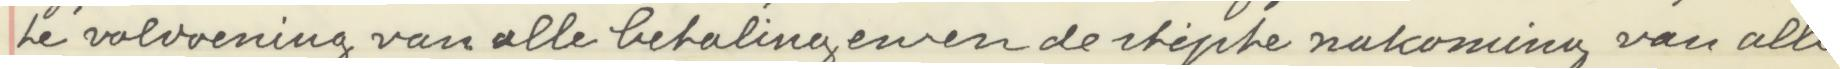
te voldoening van alle betaling en en de stipte nakoming van alle
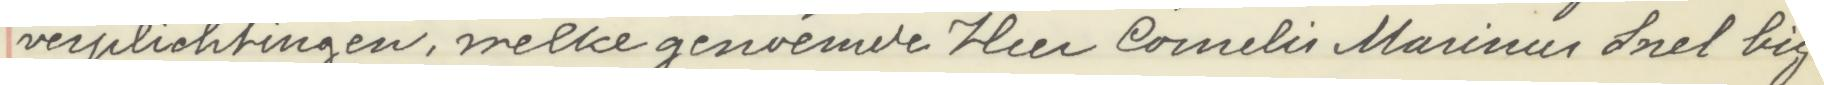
verplichtingen, welke genoemde Heer Cornelis Marinus Snel bij
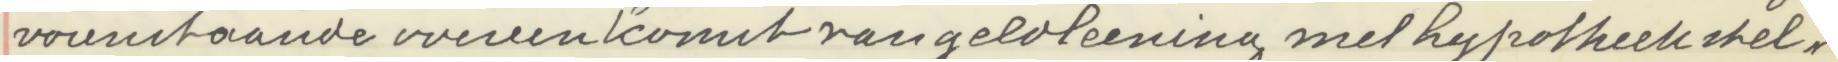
voorstaande overeenkomst van geldleening met hypotheek stel„
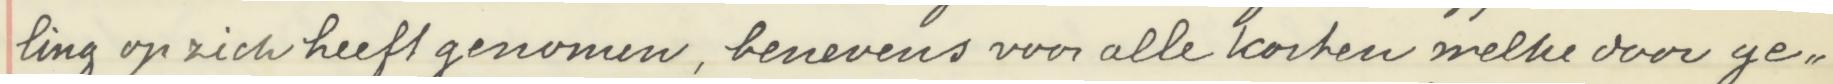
ling op zich heeft genomen, benevens voor alle kosten welke door ge„
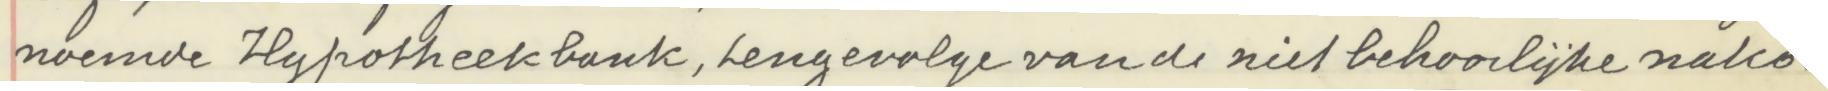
noemde Hypotheekbank, tengevolge van de niet behoorlijke nako
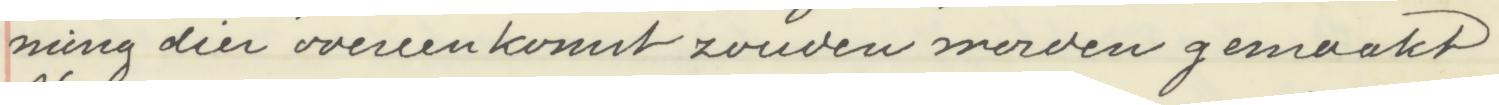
ming dier overeenkomst zouden werden gemaakt
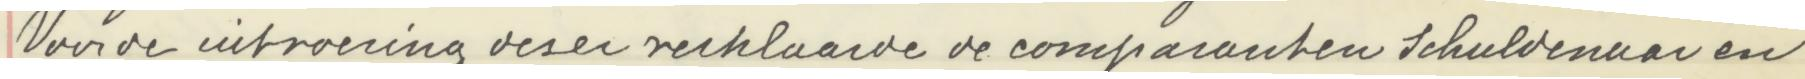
Voor de uitvoering dezer verklaarde de comparanten schuldenaar en
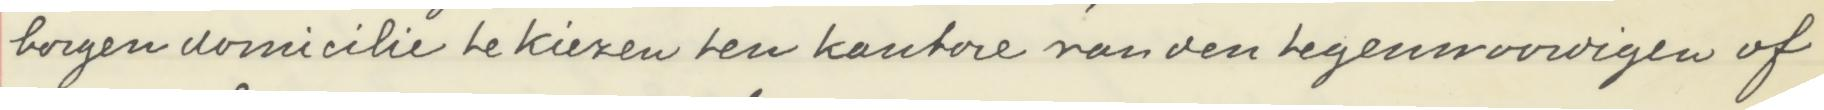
borgen domicilie te kiezen ten kantore van den tegenwoordigen of
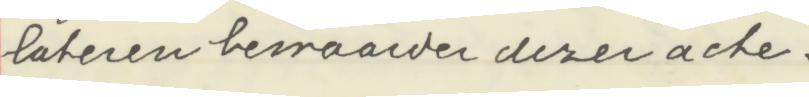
lateren bewaarden dezer acte
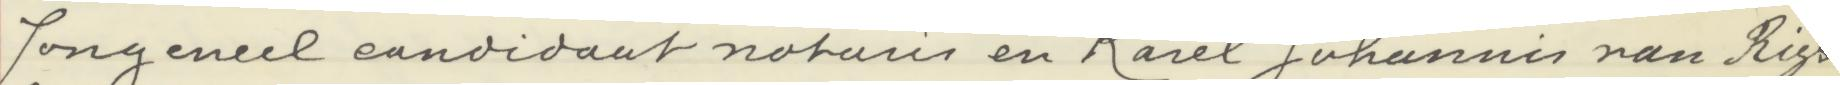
Jongeneel candidaat notaris en Karel Johannis van Rijs
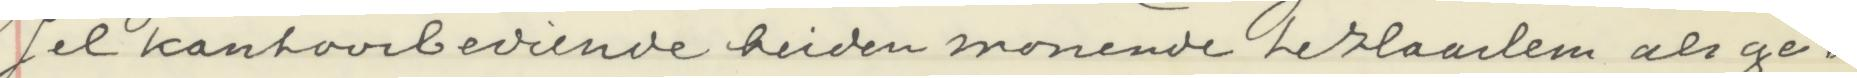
sel kantoorbediende beiden wonende te Haarlem als ge„
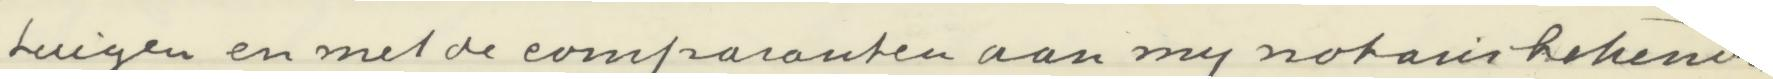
tuigen en met de comparanten aan my notaris bekend.
